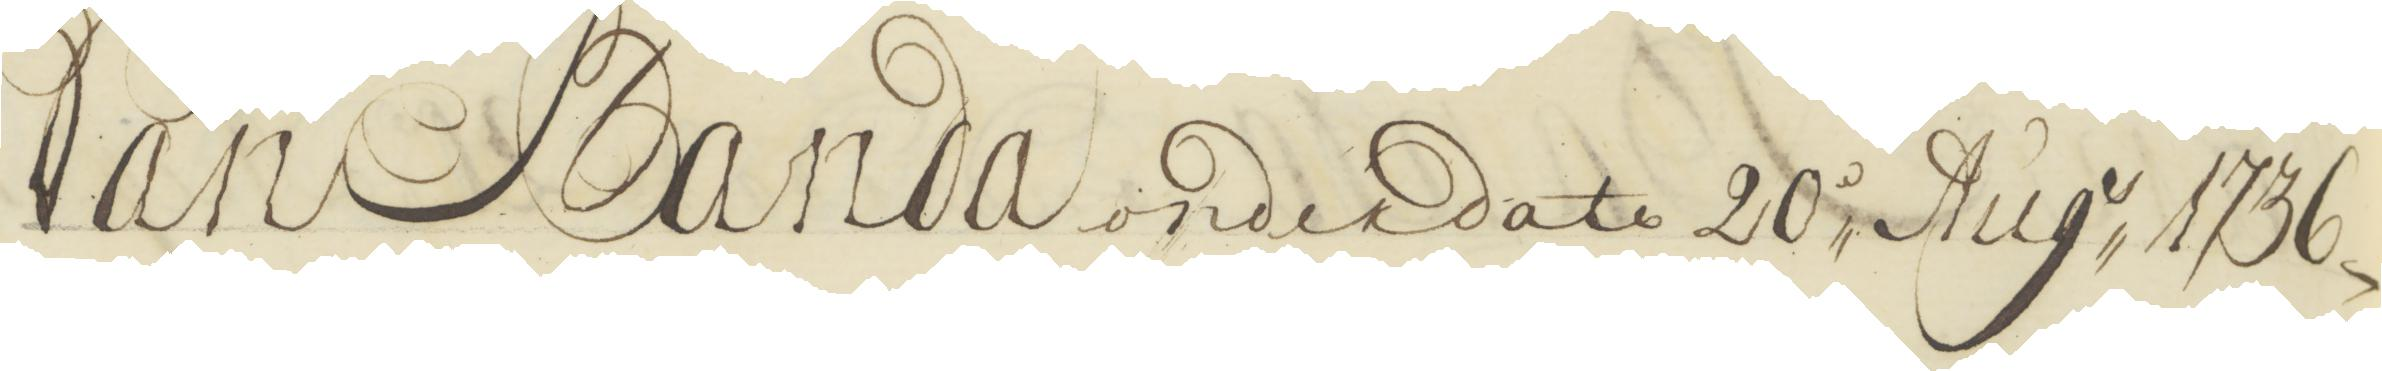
Van Banda onder dato 20„e Aug„o 1736.
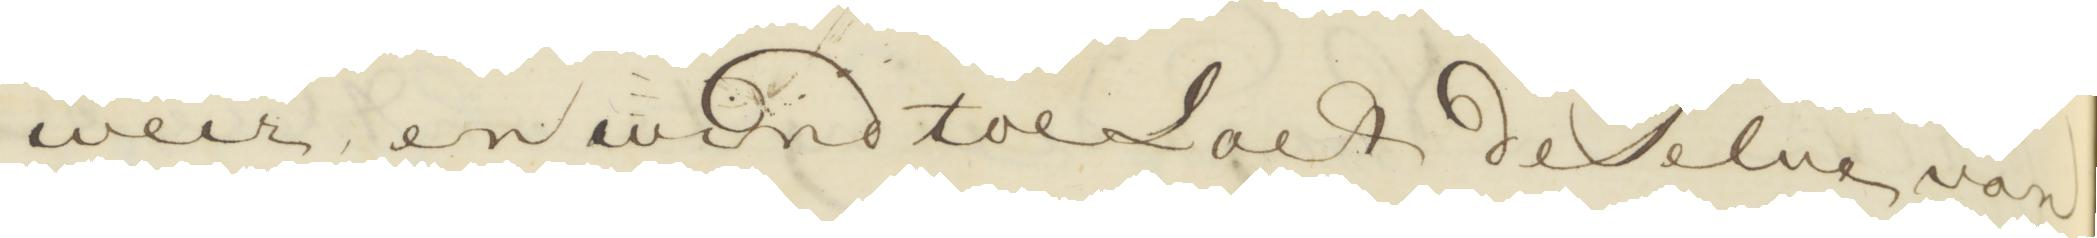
weir, en wind toe laet deselve van
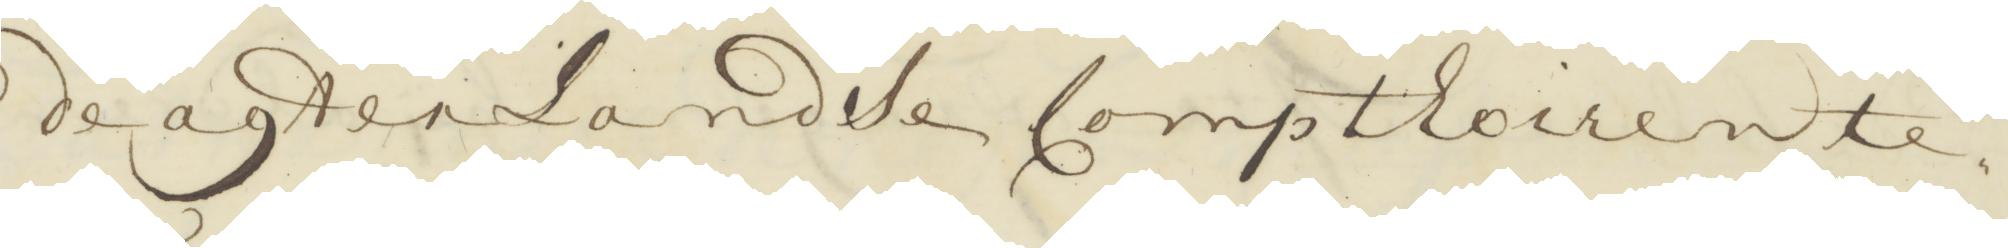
de agter Landse Compthoiren te„
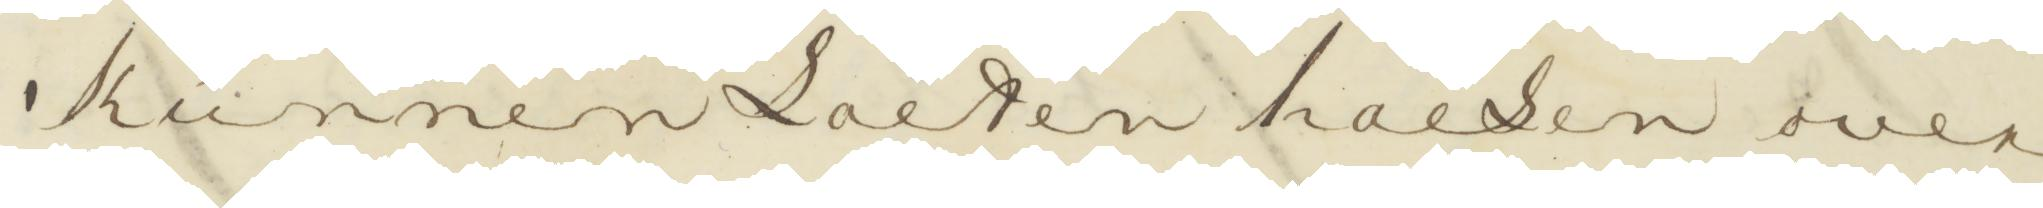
kunnen Laeten haeken over
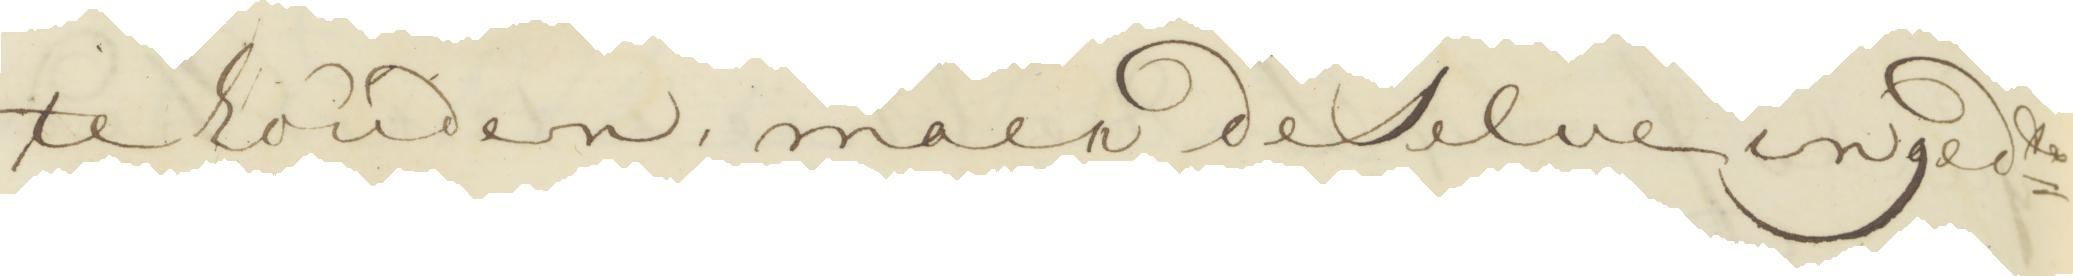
te houden, maer deselve inged=te
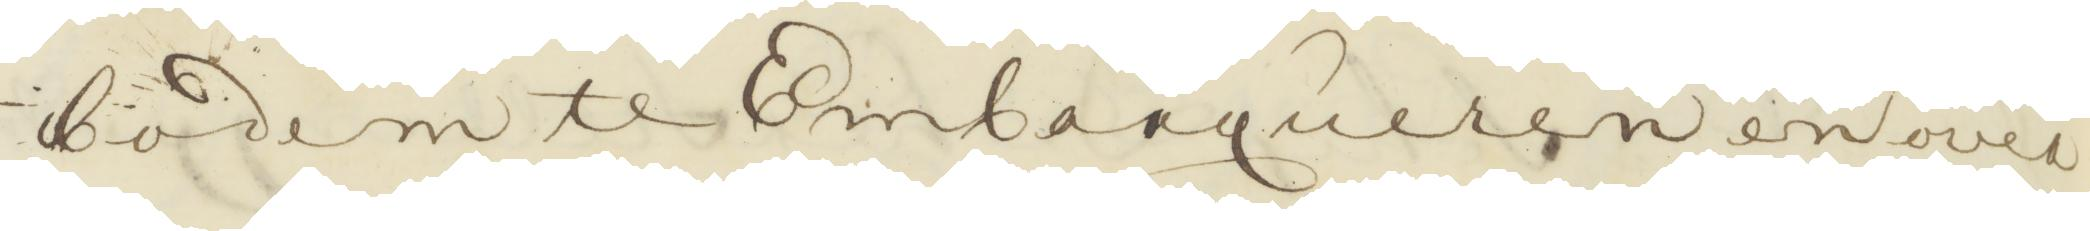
bodem te Embarqueren en over
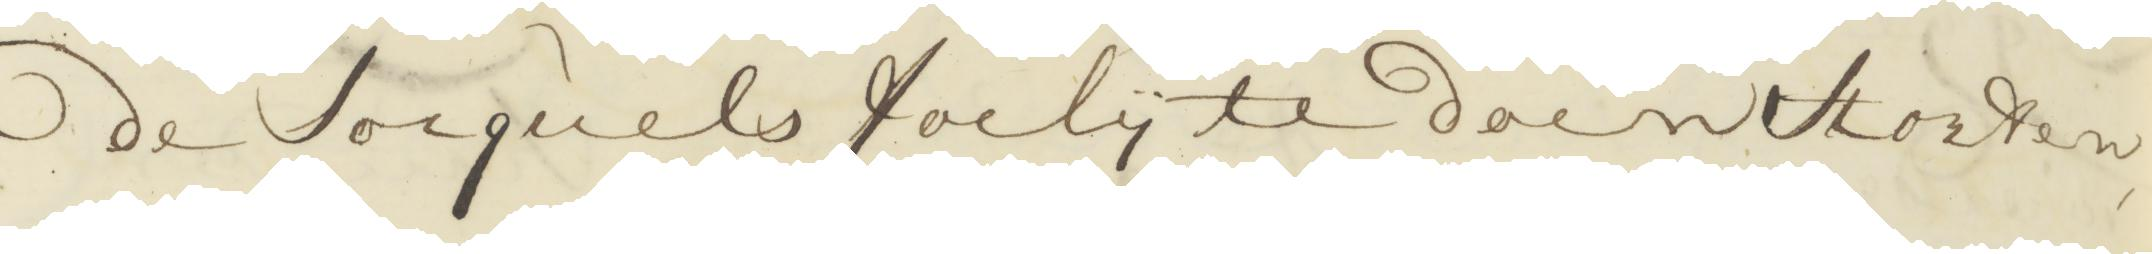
de soiquels foelij te doen storten,
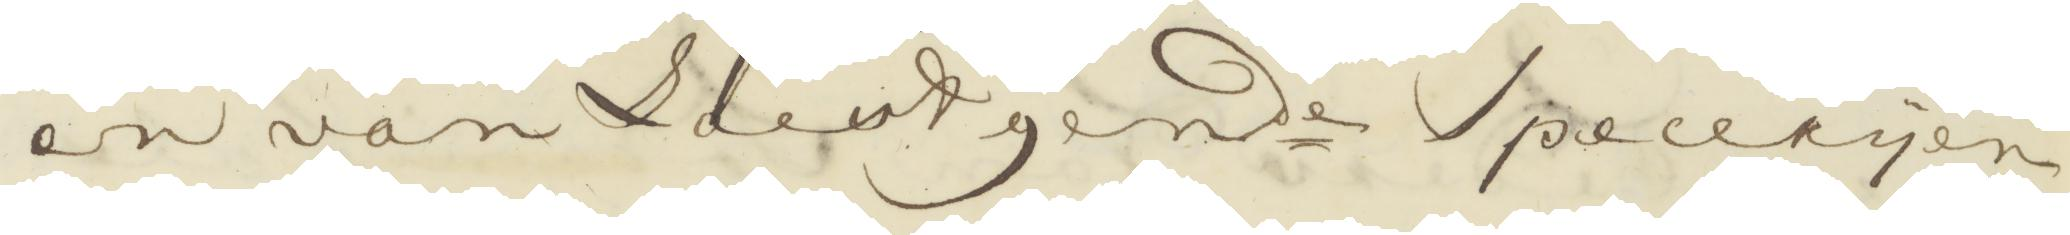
en van Laest gen=de specerijen
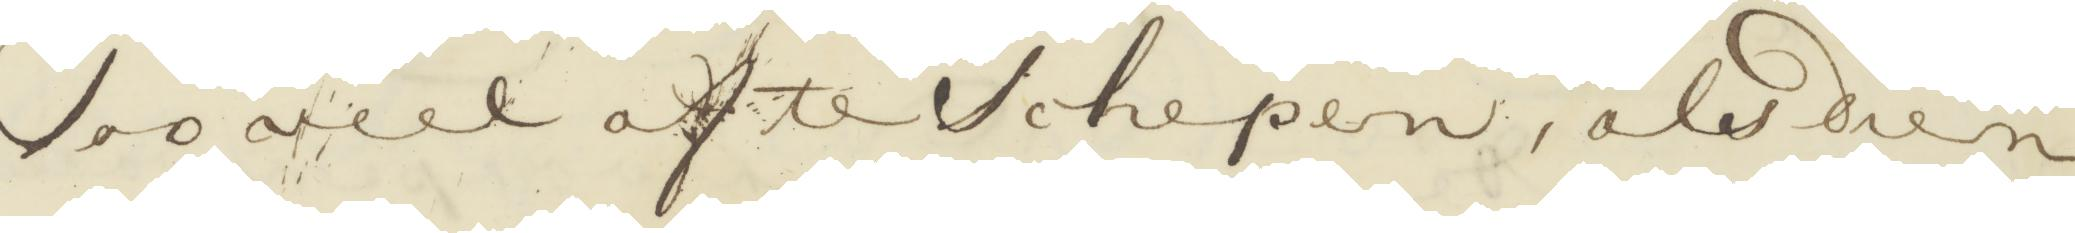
soo veel af te schepen, als dien
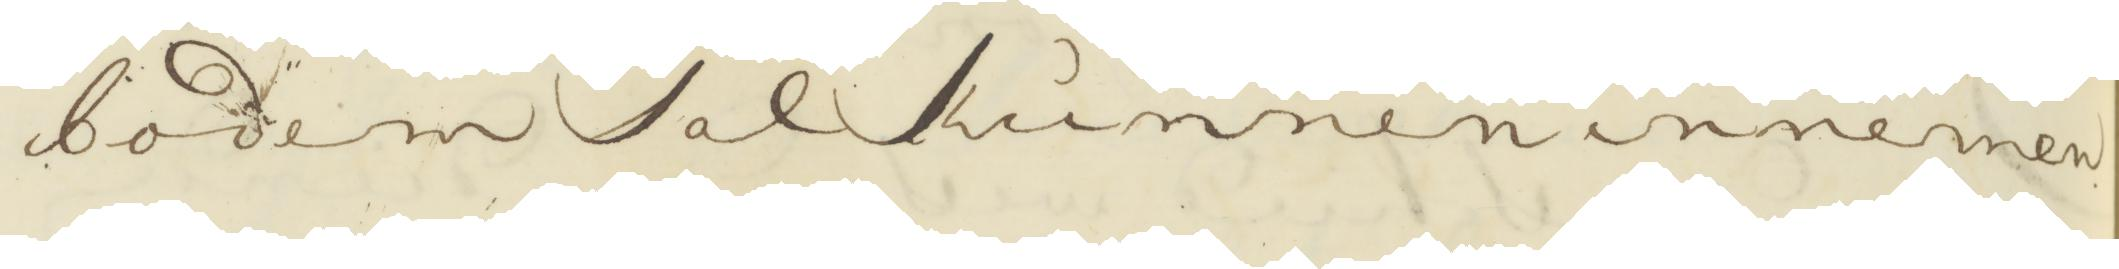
bodem sal kunnen innemen
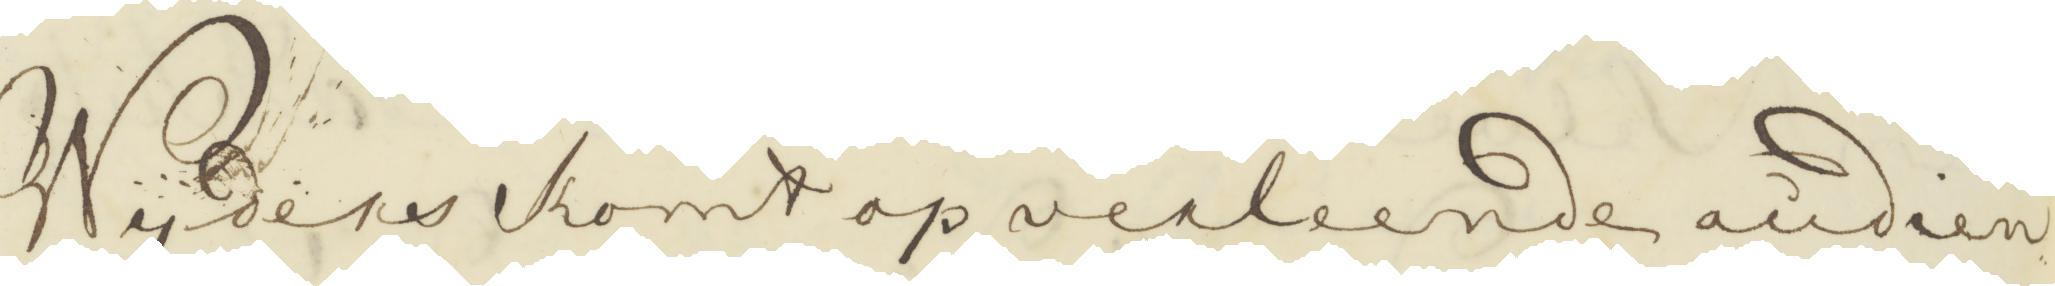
Wijders komt op verleende audien„
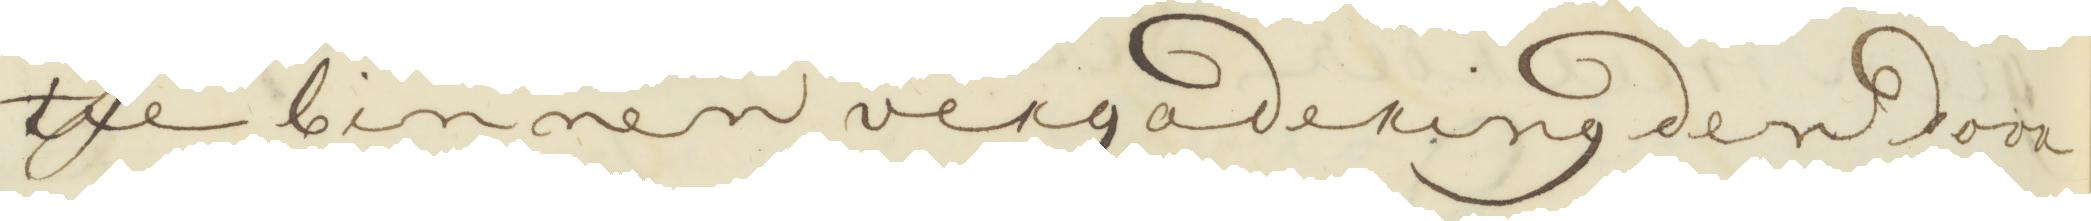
tie binnen vergadering den door
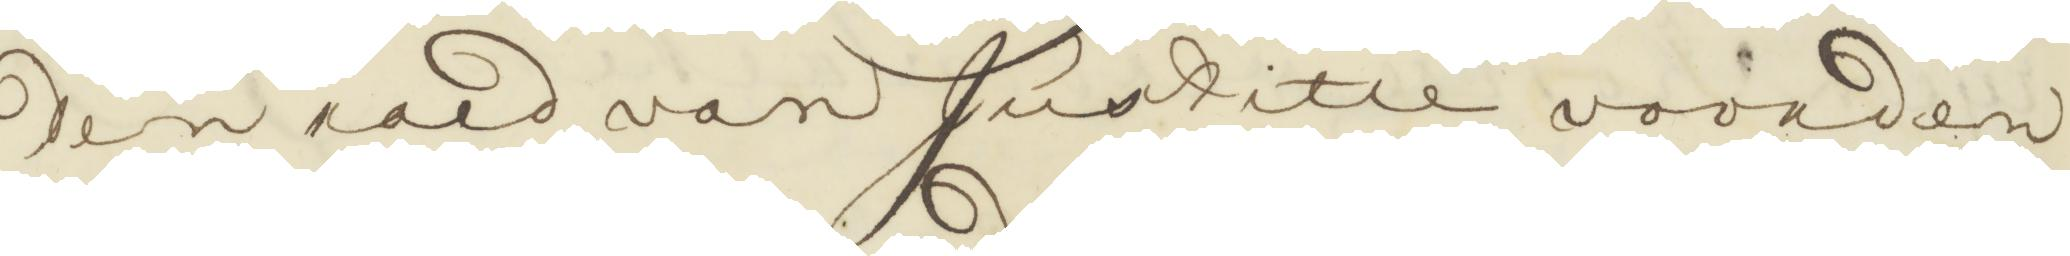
den raed van Justitie voor den
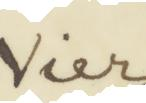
Vier
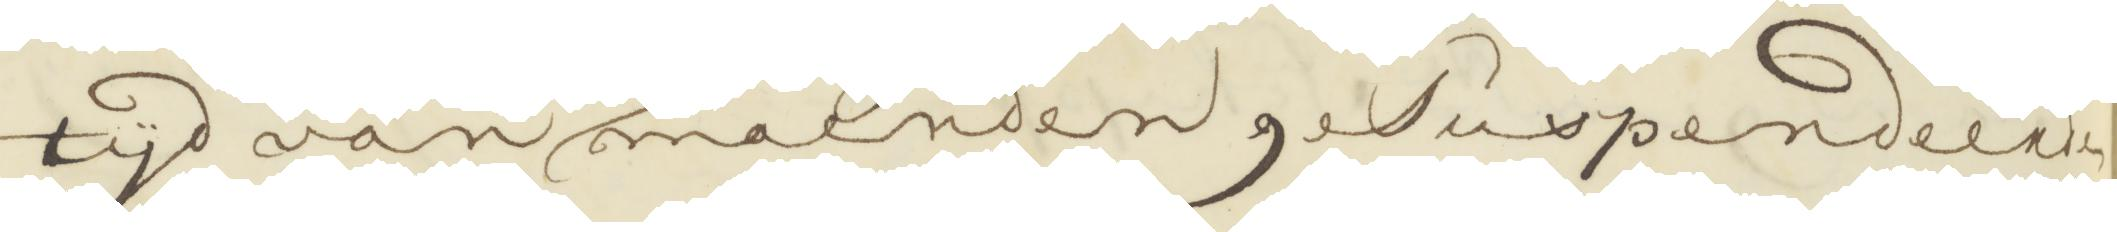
tijd van maenden gesuspendeerden
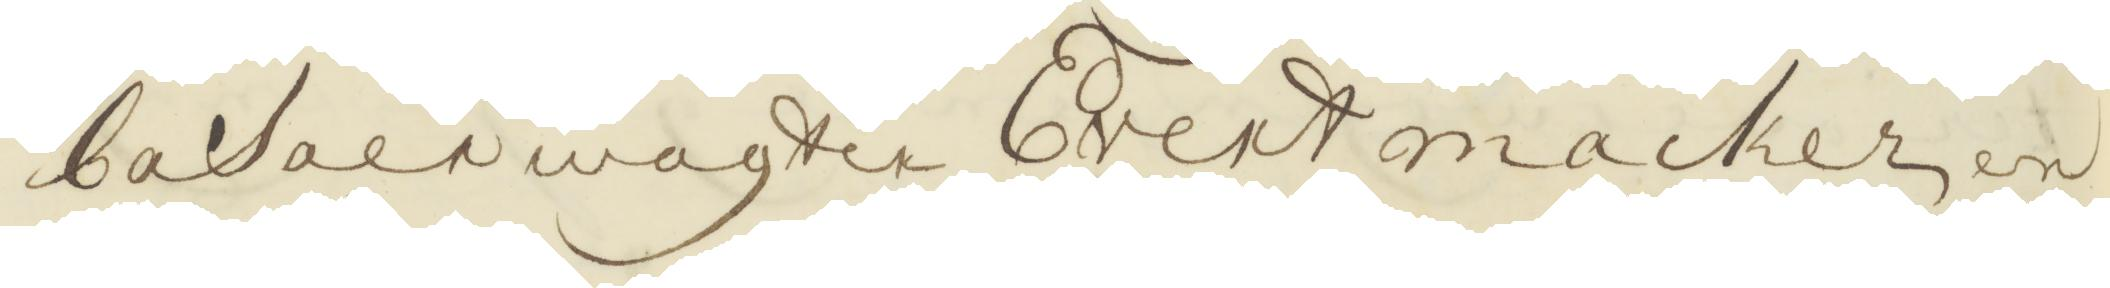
basaer wagter Evert macker en
